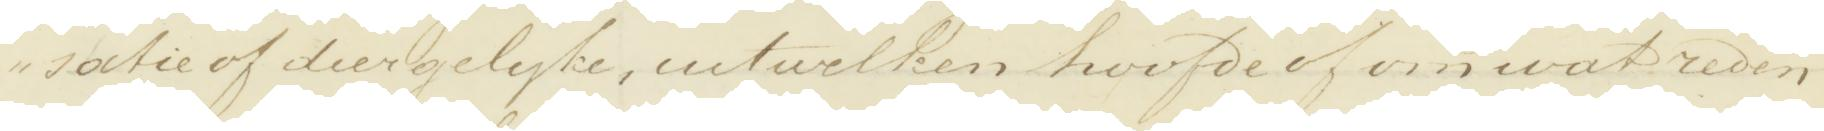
„satie of diergelyke, intwelken hoofde of om wat reden
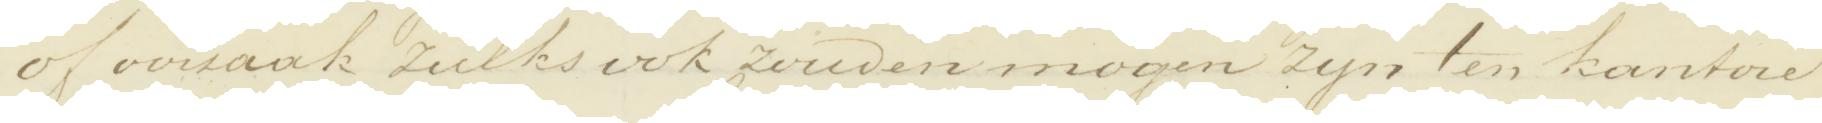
of oorzaak zulks ook zouden mogen zyn ten kantore
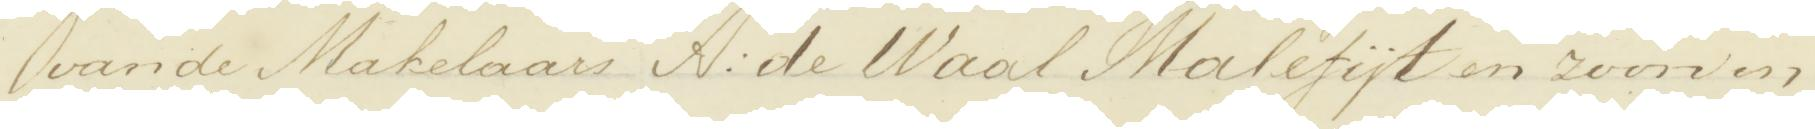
van de Makelaars A: de Waal Malefijt en zoon en
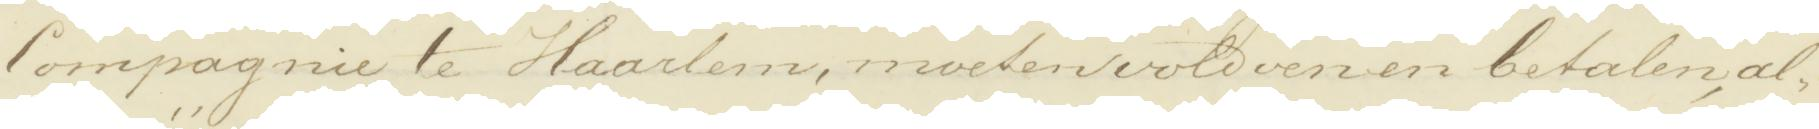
Compagnie te Haarlem, moeten voldoen en betalen, al„
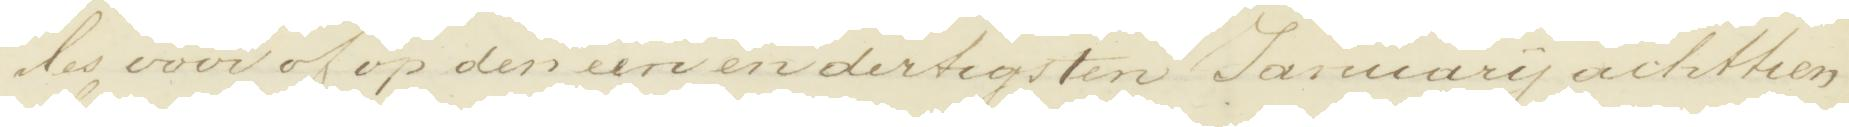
les, vóór of op den een en dertigsten Ianuarij achttien
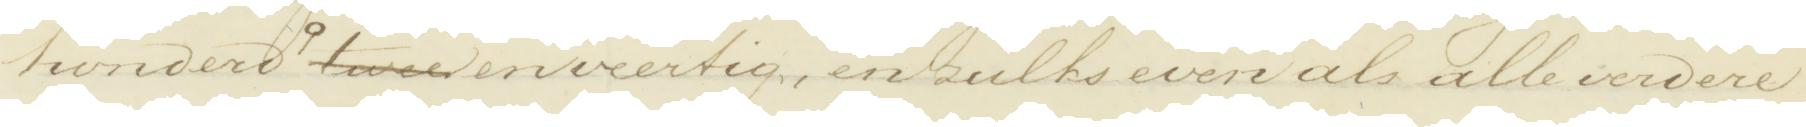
honderd ¶twee en veertig, en zulks even als alle verdere
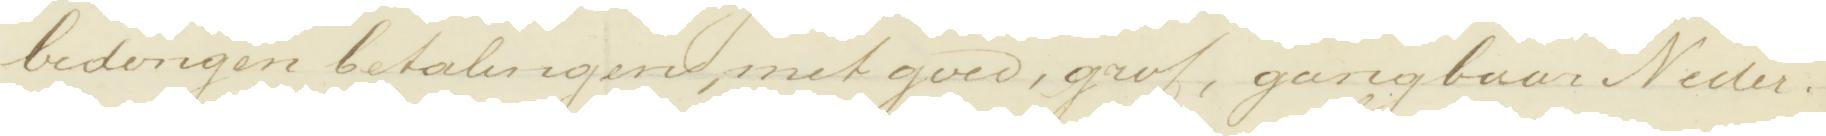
bedongen betalingen, met goed, grof, gangbaar Neder,
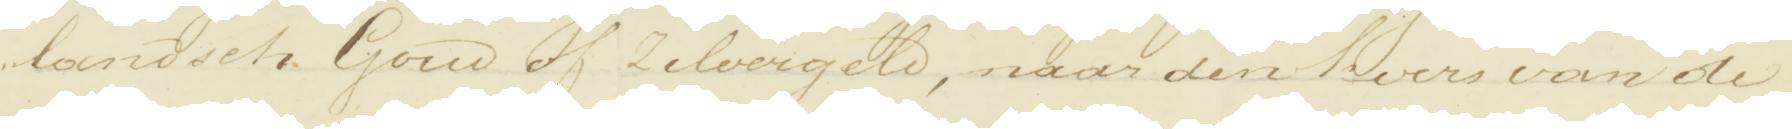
,landsch Goud of Zilvergeld, naar den koers van de
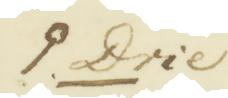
¶ Drie
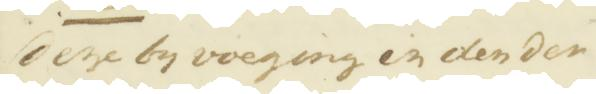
deze by voeging in den der
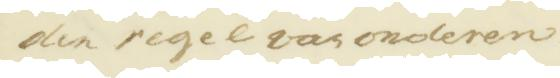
den regel van onderen
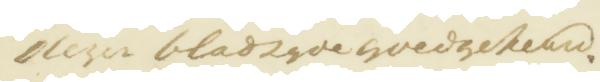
dezer bladzyde goedgekeurd
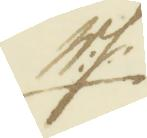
W:S.
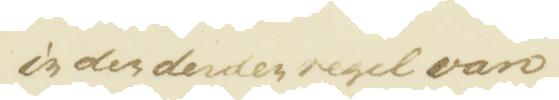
in den derden regel van
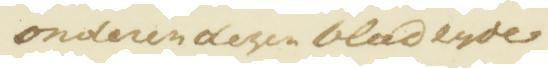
onderen dezen bladzyde
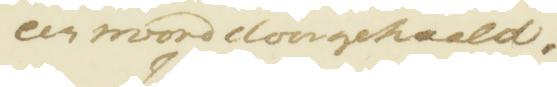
een woord doorgehaald.
